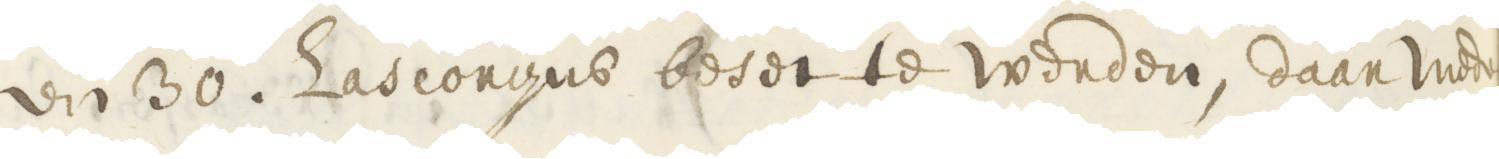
en 30. Lascorijns beset te werden, daar mede
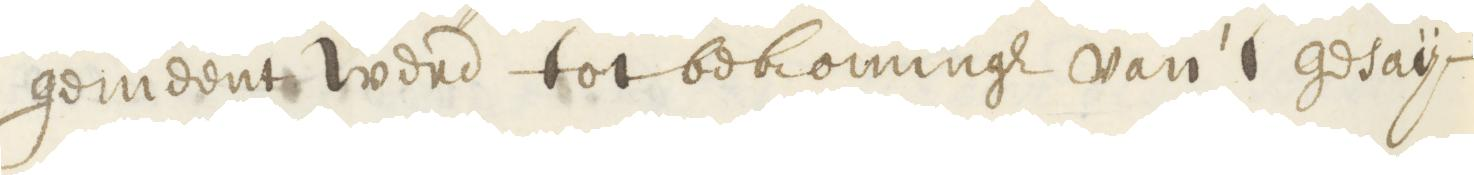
gemeent werd tot bekomingh van ’t gesaij
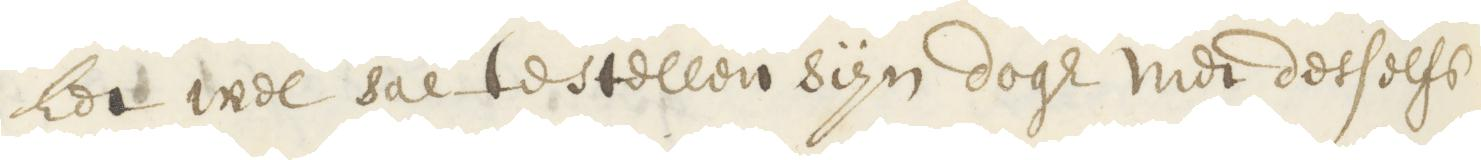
het wel sal testellen sijn dogh met desselfs
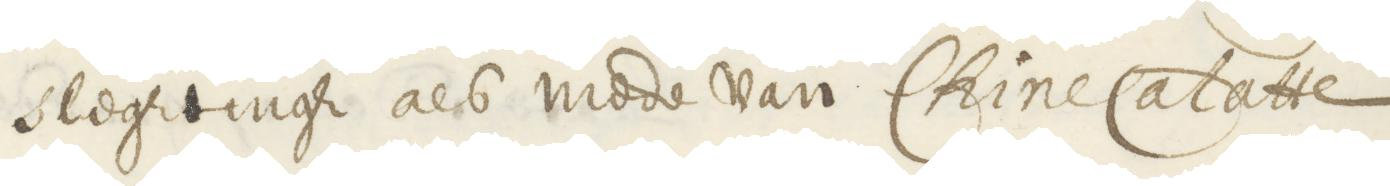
sleghtingh als mede van Chinecalatte
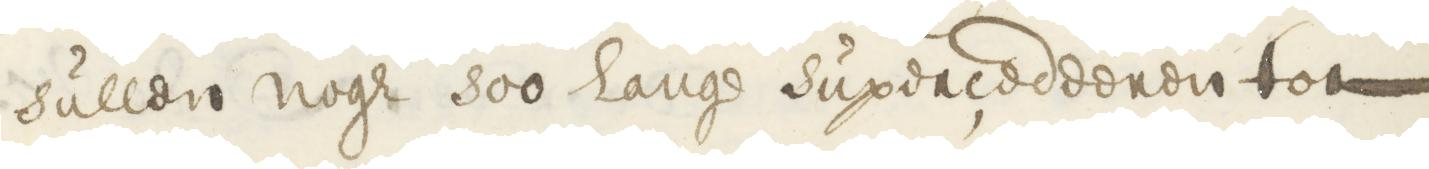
sullen nogh soo lange supercedeeren tot
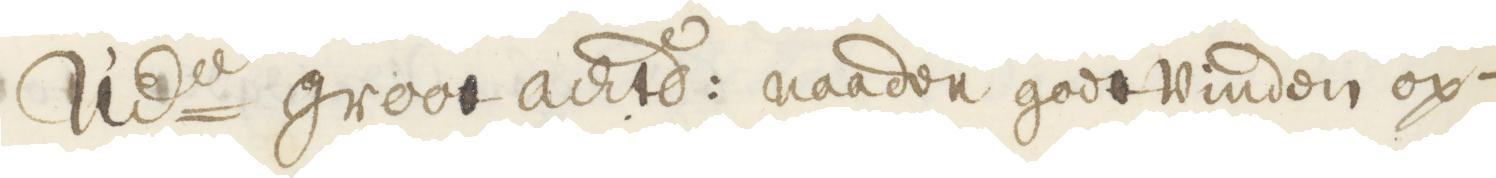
UE=le groot achtb: naader goet vinden op
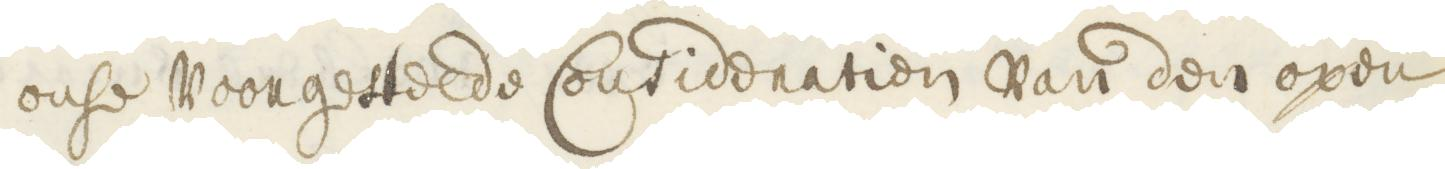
onse voorgestelde Consideratien van den open
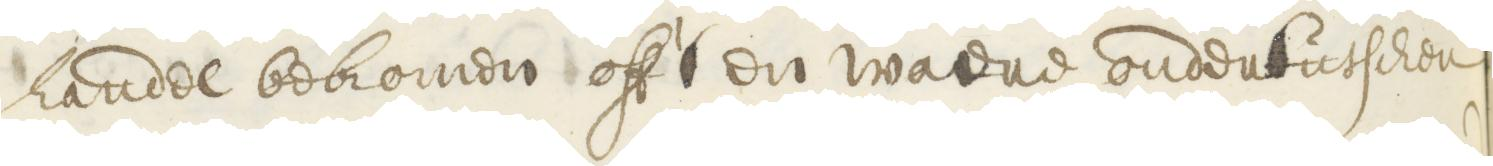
handel bekomen off ’t en waere ondertusschen
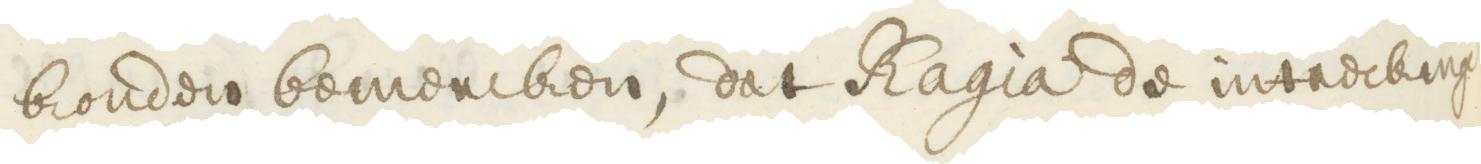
konden bemercken, dat Ragia de intrecking
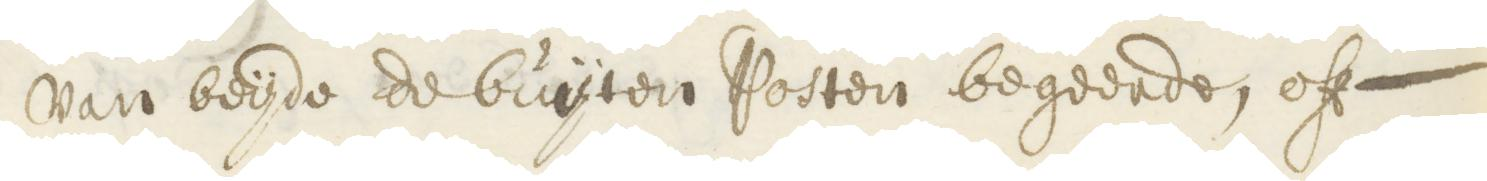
van beijde de buijten posten begeerde, off —
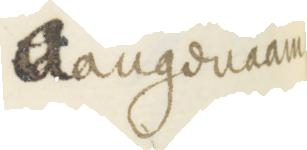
Aangenaam
